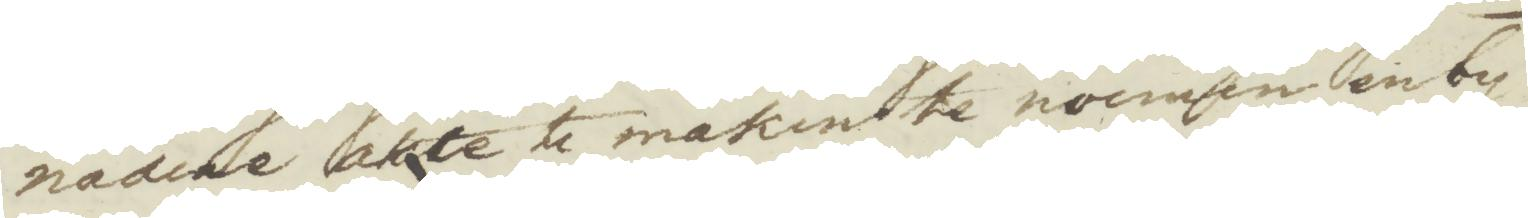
nadere akte te maken te noemen en by
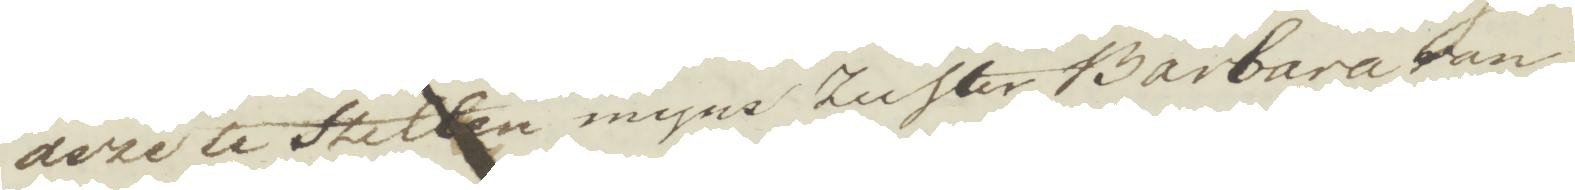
deze te stellen myne Zuster Barbara van
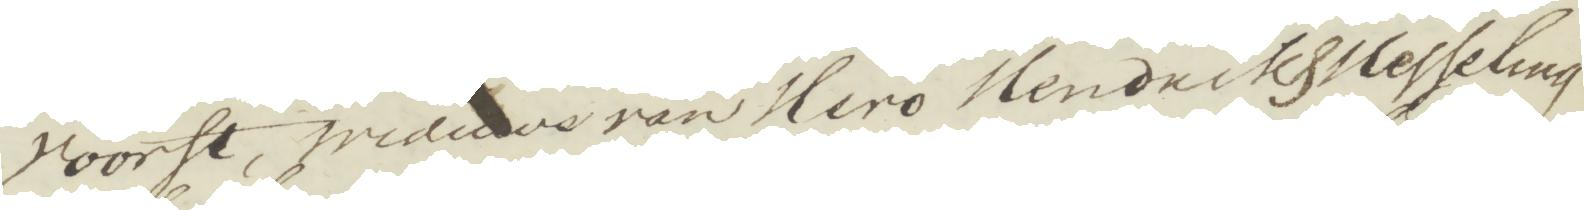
Voorst, weduwe van Hero Hendriks Hesseling
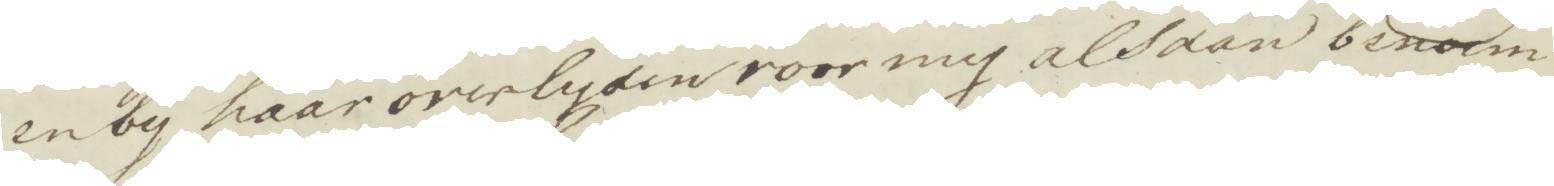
en by haar overlyden voor my als dan benoem
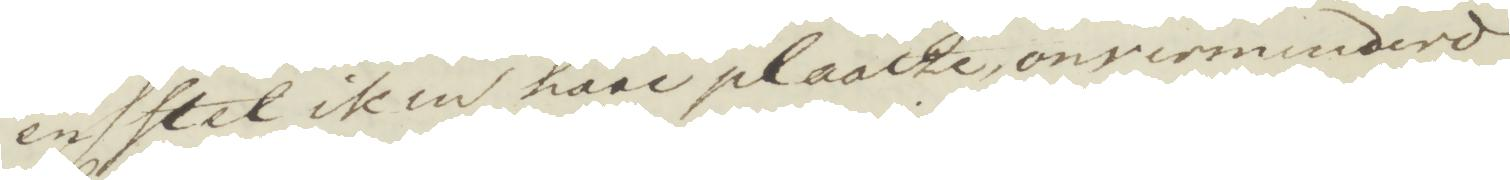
en stel ik in hare plaatze, onverminderd
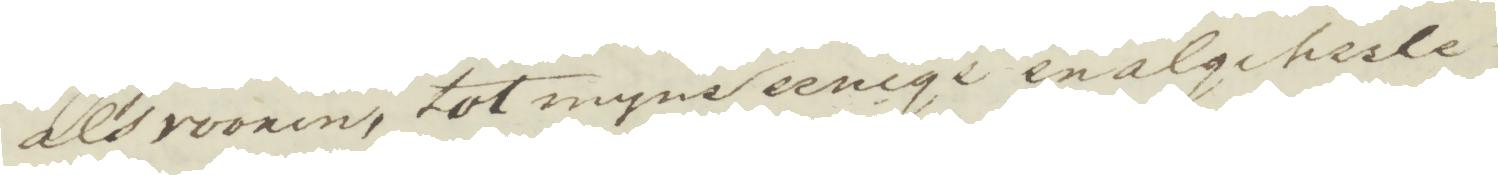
als vooren, tot myne eenige en algeheele
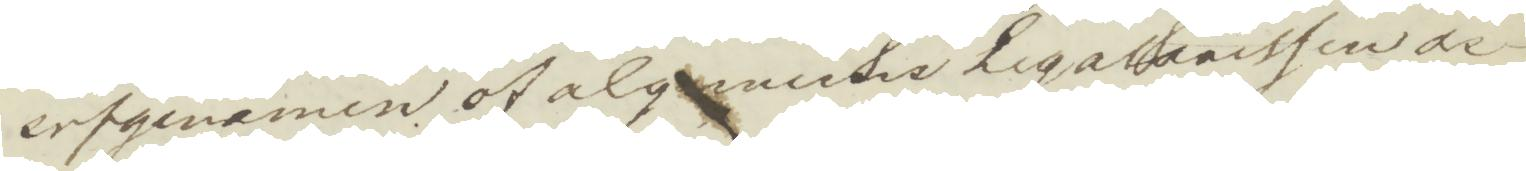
erfgenamen, of algemeene Legatarissen de
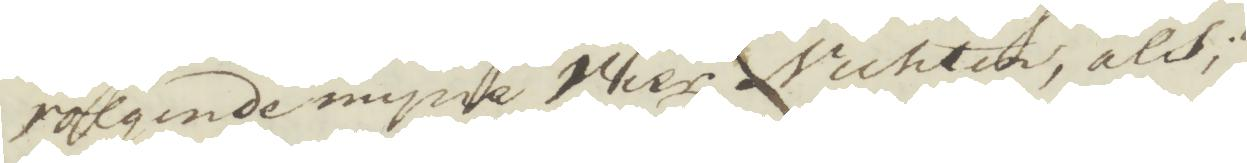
volgende mijne Vier Nichten, als;
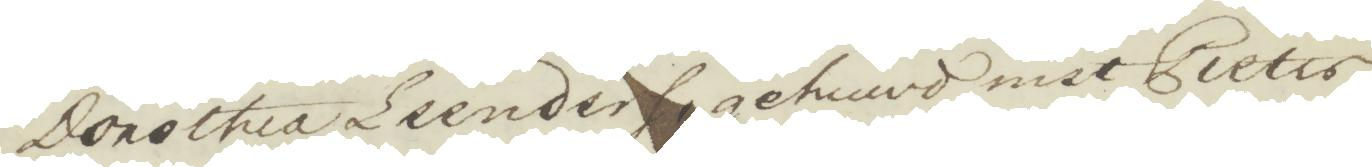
Dorothea Leenders, gehuwd met Pieter
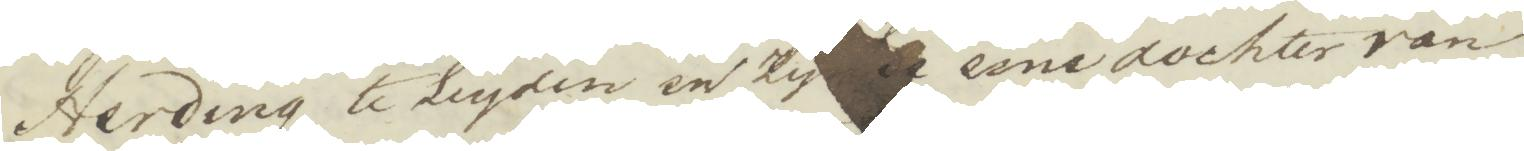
Herding te Leyden en zynde eene dochter van
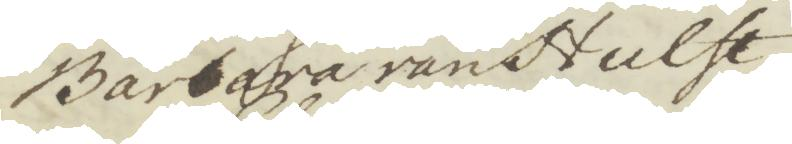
Barbara van Hulst.
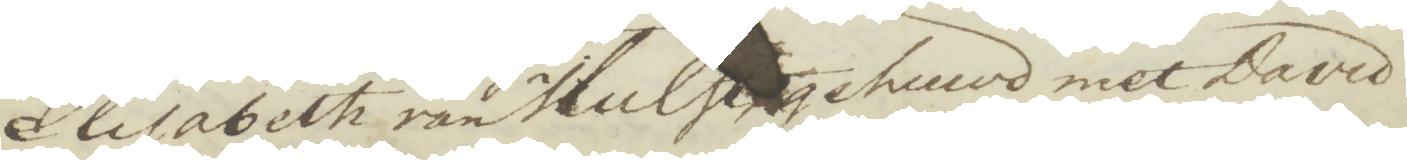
Elisabeth van Hulst, gehuwd met David
